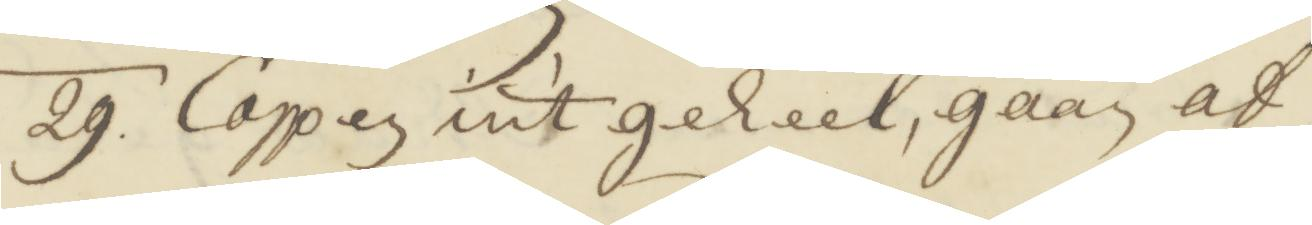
29. Coppen in’t geheel, gaan af
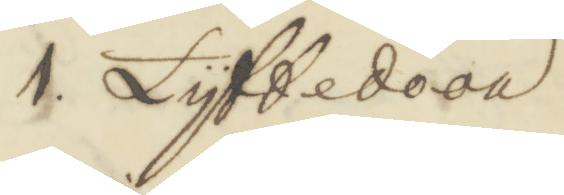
1. tijffedoor
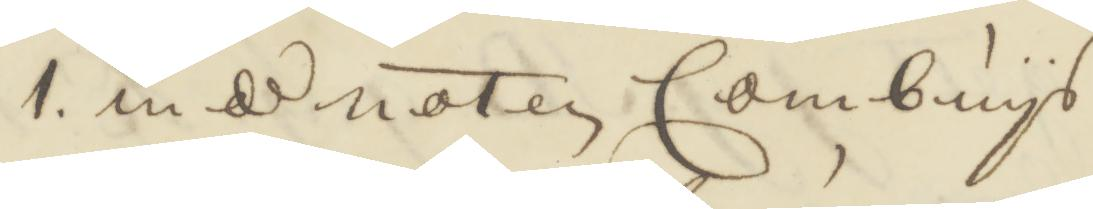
1. in de noten combuijs
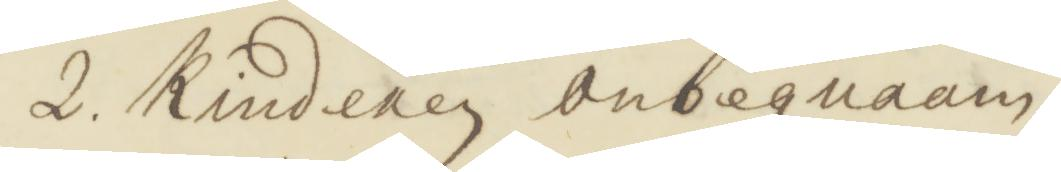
2. kinderen onbequaam
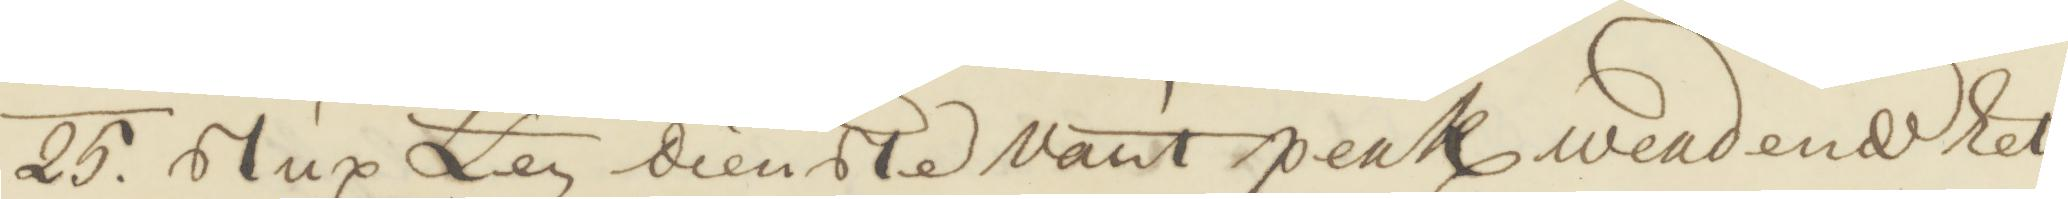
25. stux ten dienste van’t perk werdende het
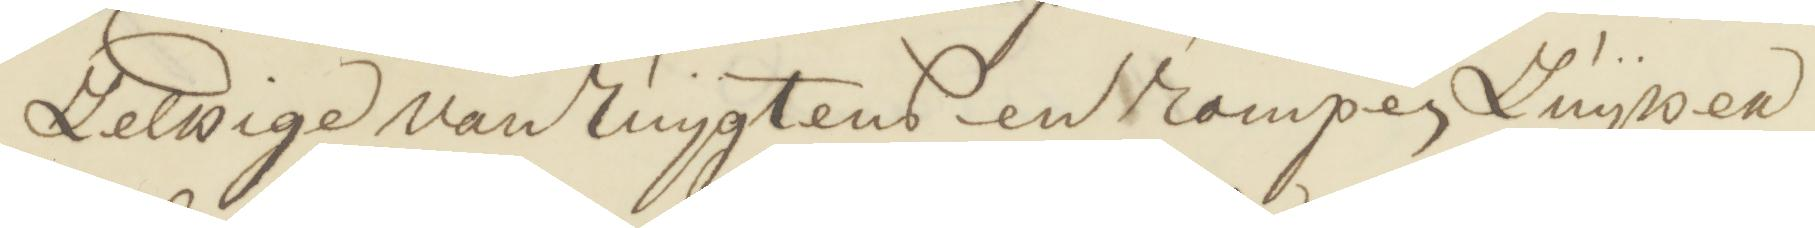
zelvige van ruijgtens en rampen zuijver
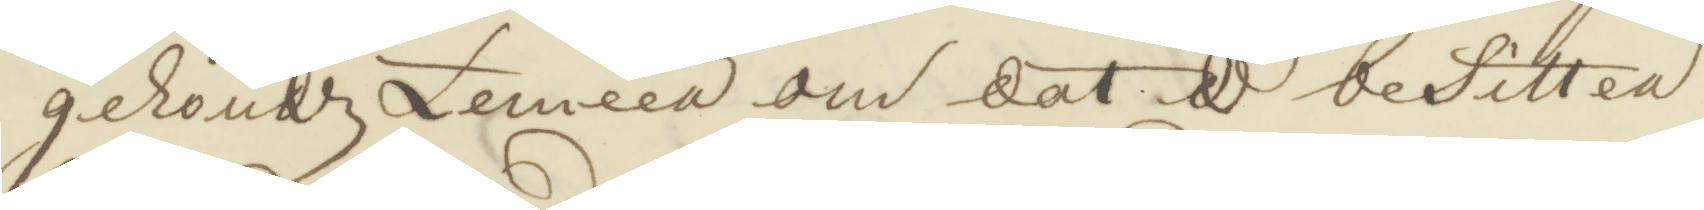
gehouden temeer om dat de besitter
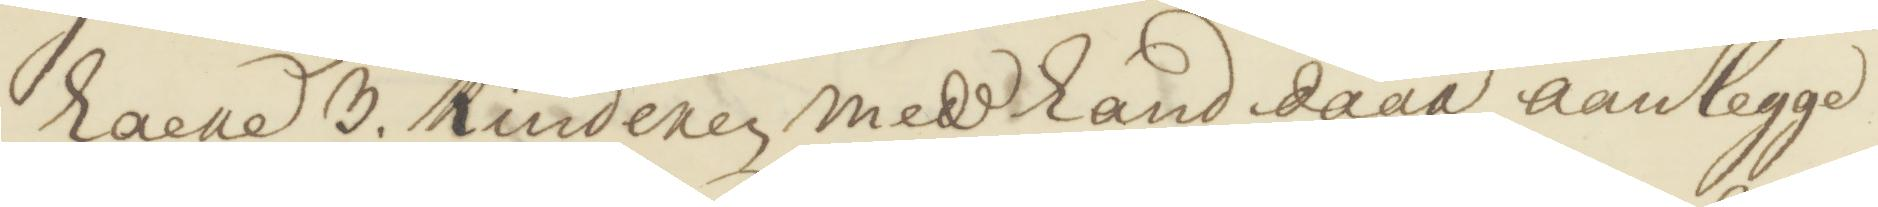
haere 3. kinderen mede hand daar aan legge
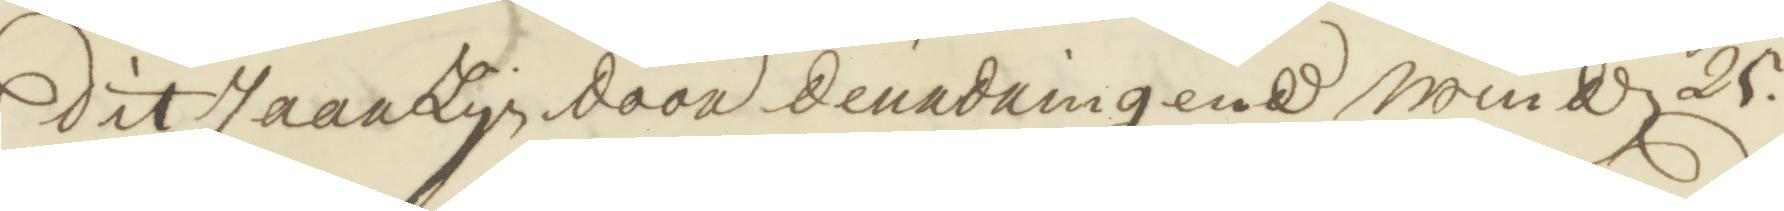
dit Jaar zijn door deurdringende winden 25.
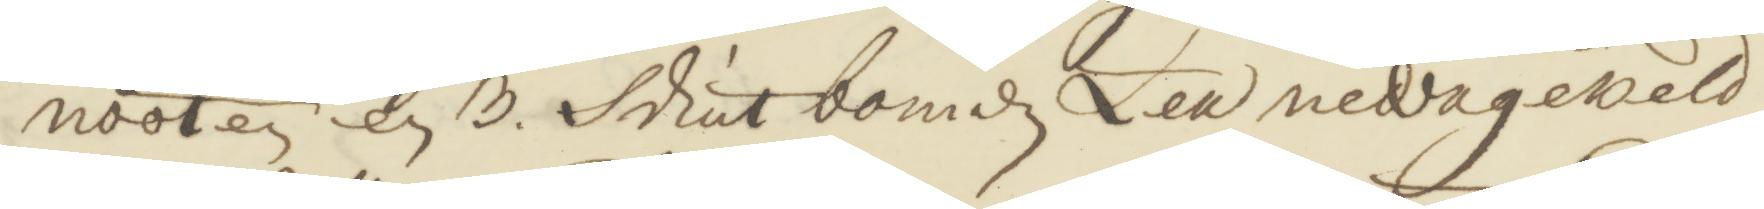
nooten en 3. schut bomen ter nedergeveld
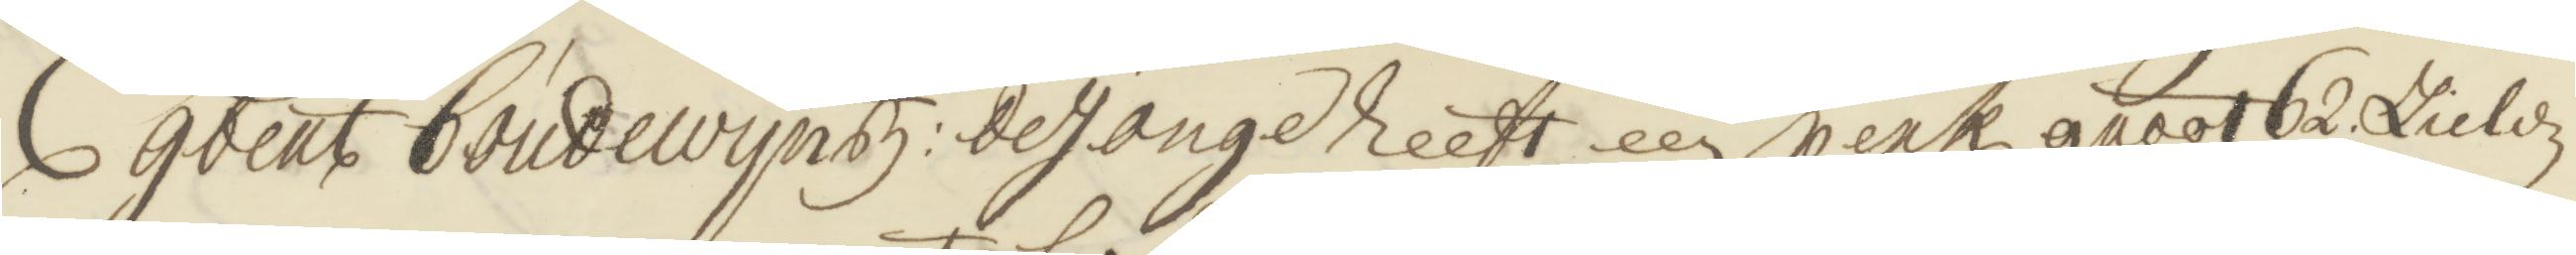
Egbert boudewijnsz: deJonge heeft een perk groot 62 zielen
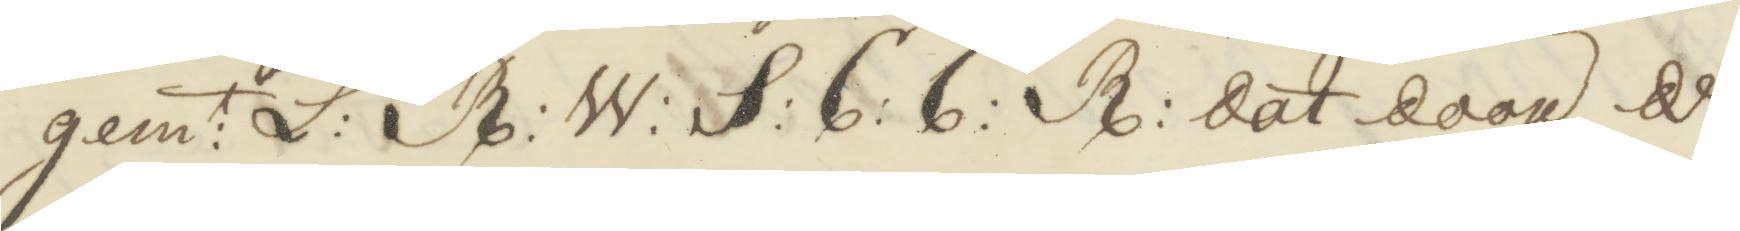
gem:t L: R: W: S: C: C: R: dat door den
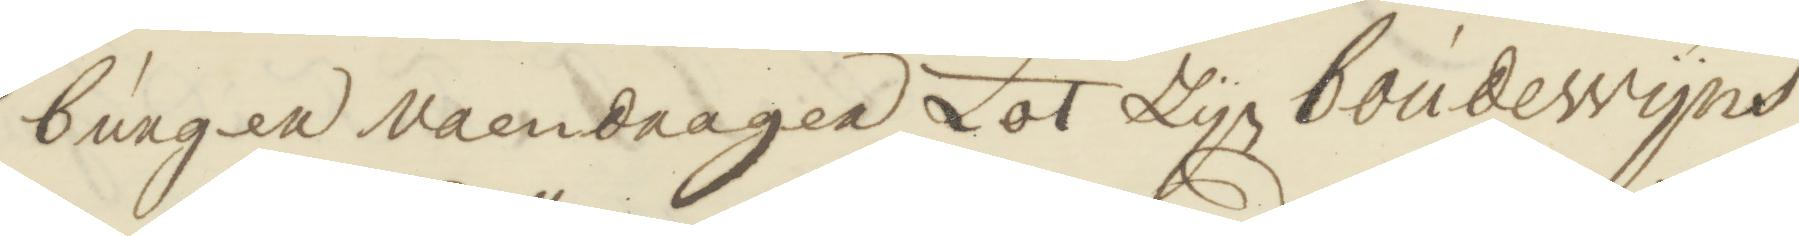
burger vaendrager tot zijn boudewijns
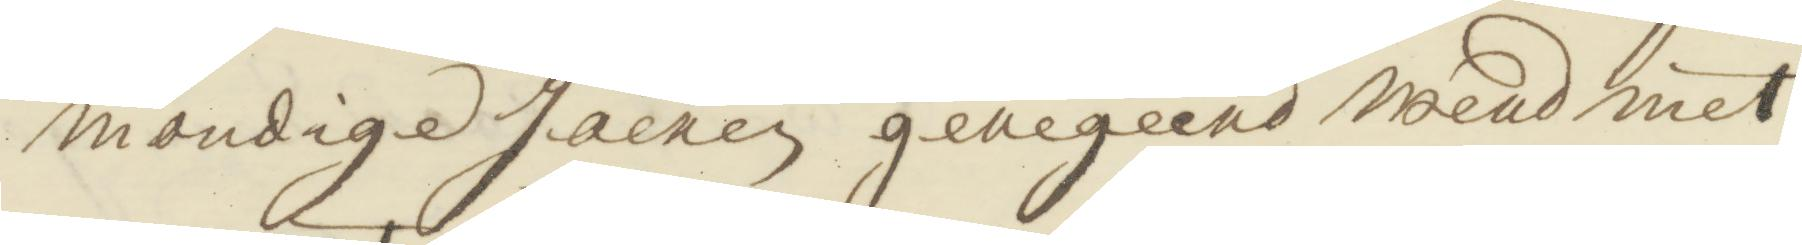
mondige Jaeren geregeerd werd met
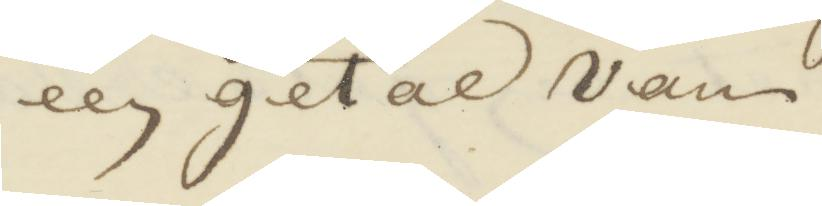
een getal van
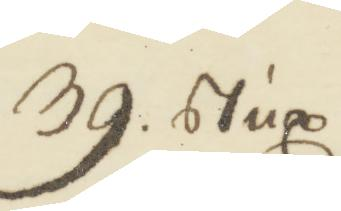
39. stux
